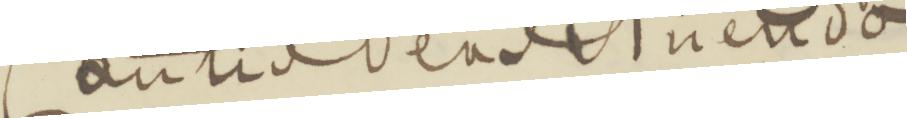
Cautie de restuendo.
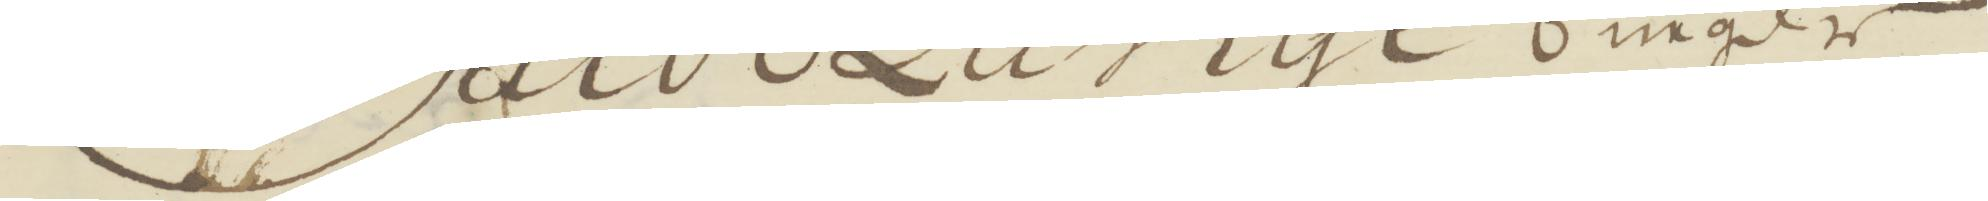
Jacob Lange burger
